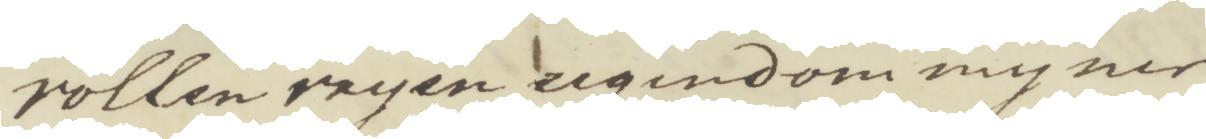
vollen vryen eigendom myner
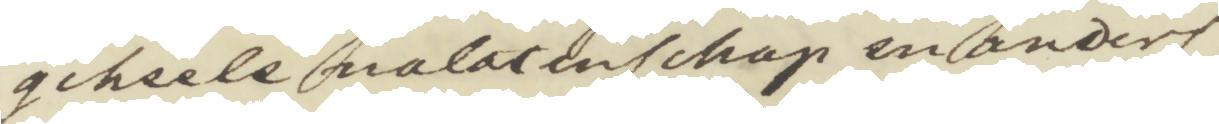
geheele nalatenschap en anders
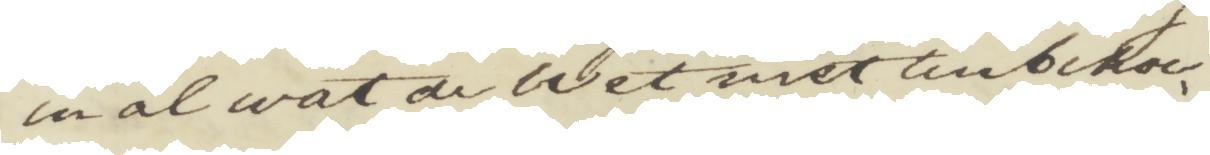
in al wat de Wet niet ten behoe„
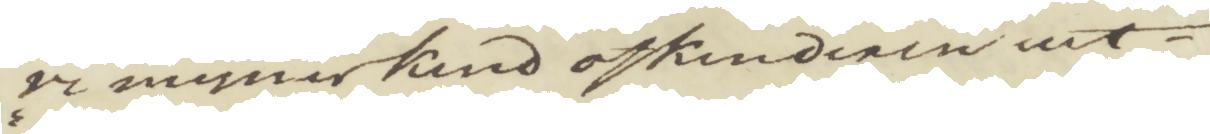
ve myner kind of kinderen uit
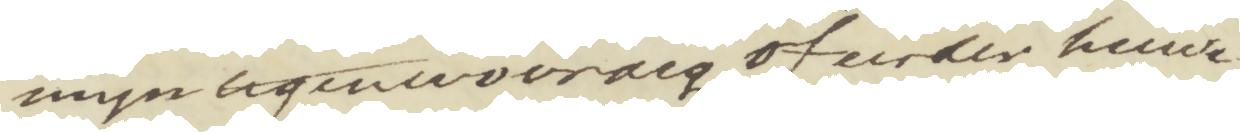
myn tegenwoordig of eerder huwe,
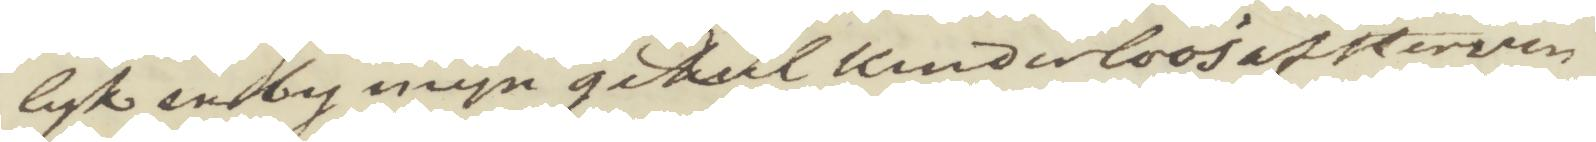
lyk en by myn geheel kinderloos afsterven
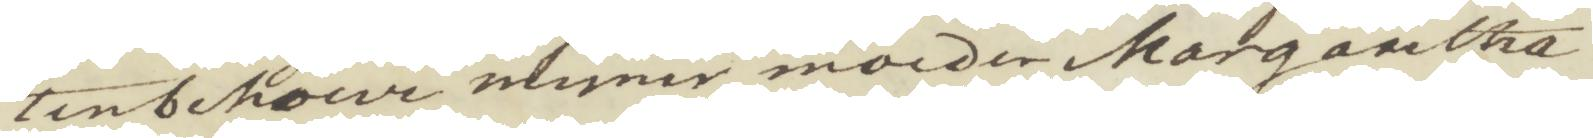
ten behoeve myner moeder Margaretha
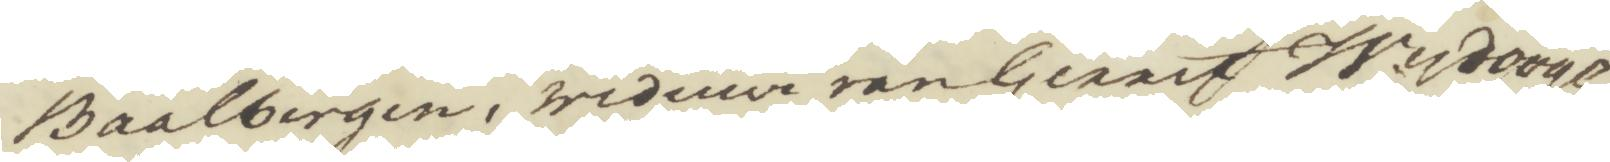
Baalbergen, weduwe van Gerrit Wydoogen
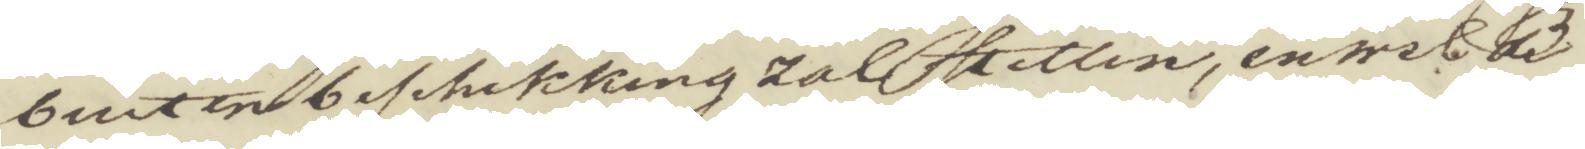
buiten beschikking zal stellen, en wel de
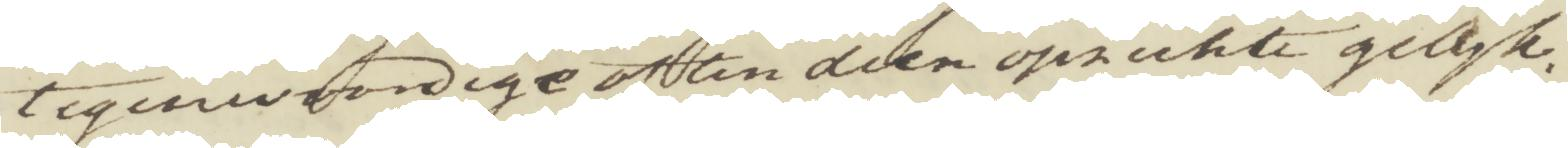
tegenwoordige of ten dien opzichte gelyk„
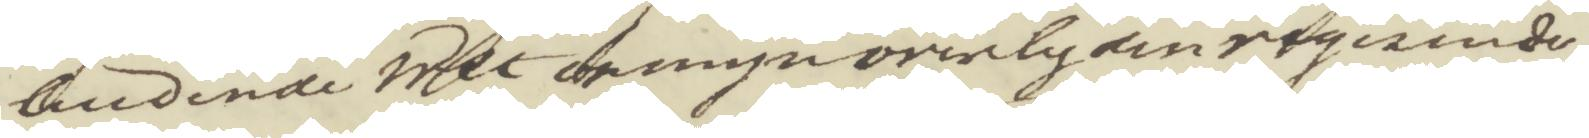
luidende wet op myn overlyden vigerende,
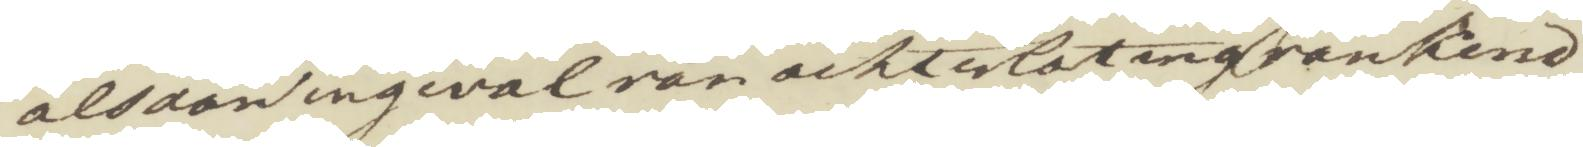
als dan ingeval van achterlating van kind
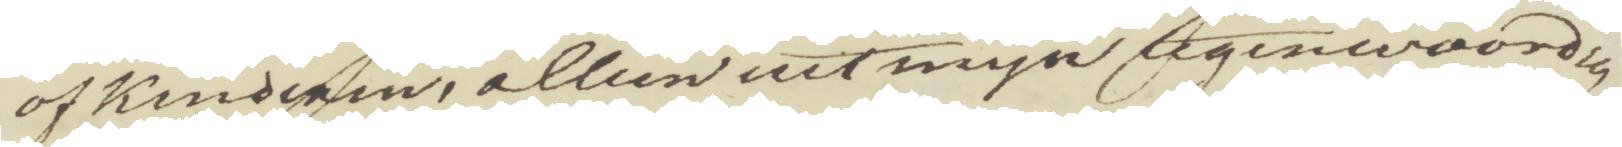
of kinderen, alleen uit myn tegenwoordig
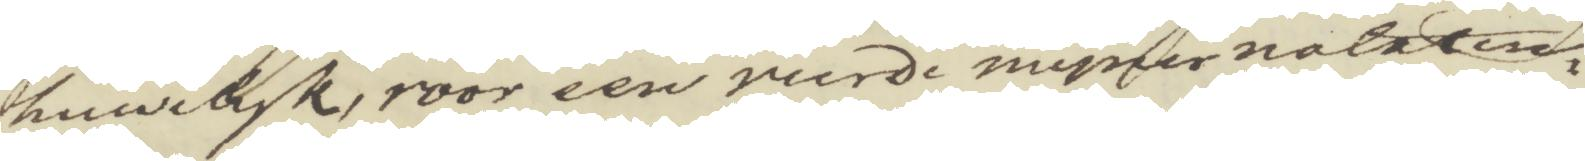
huwelyk, voor een vierde myner nalaten:
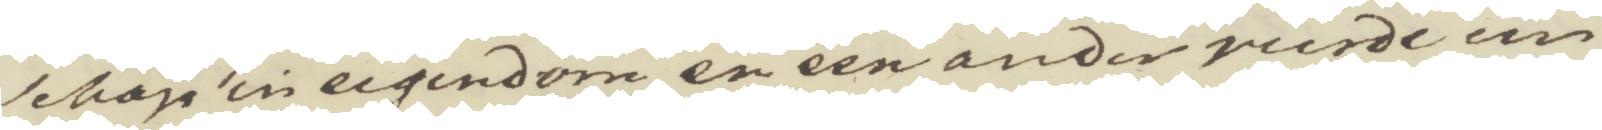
schap in eigendom en een ander vierde in
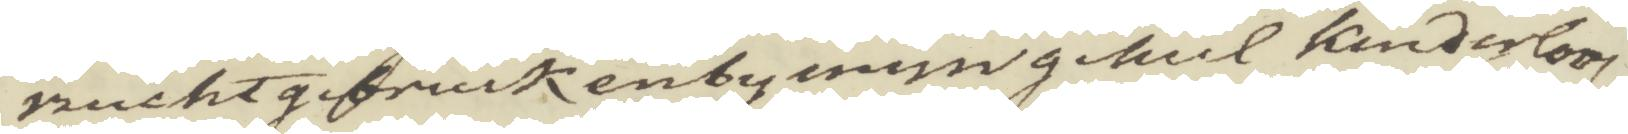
vruchtgebruik en by myn geheel kinderloos
